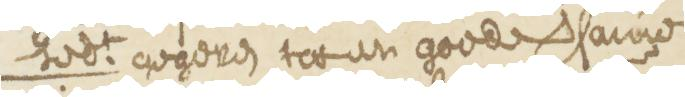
hebt gegeven tot een goede versame
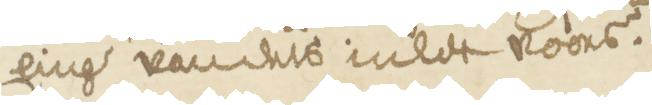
ling van erts in het voors
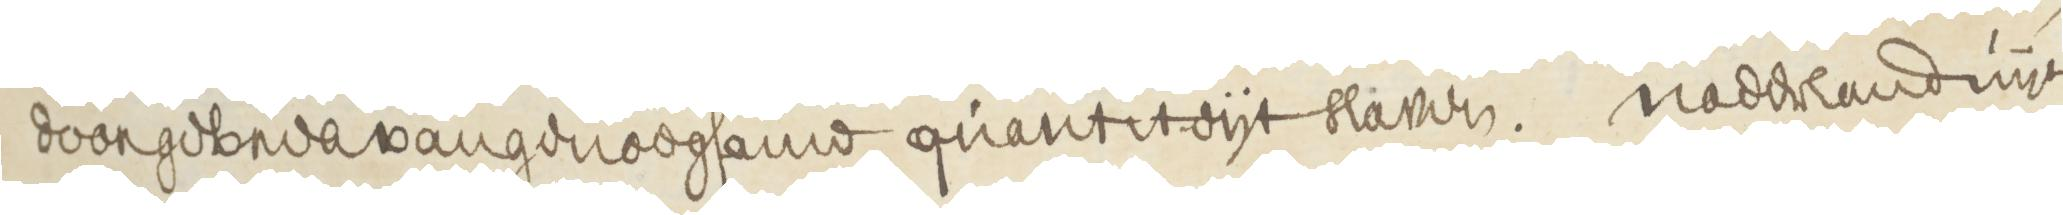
door gebrek van genoegsame quantiteijt slaven. Naderhand uijt
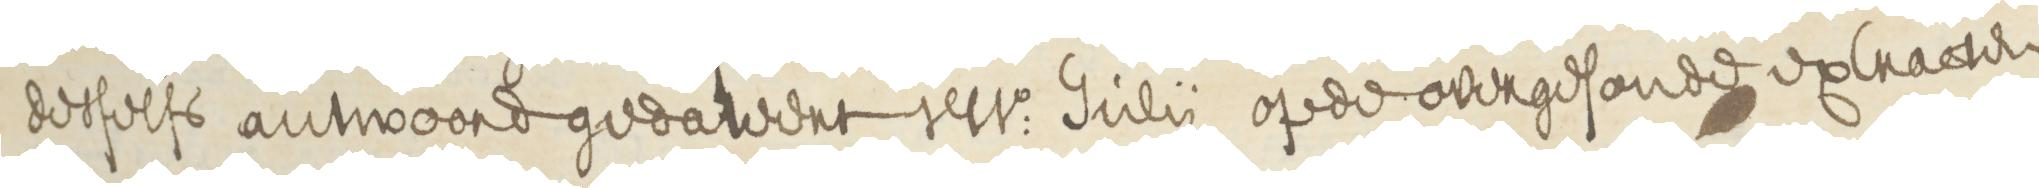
desselfs antwoord gedateert ult:o Iulij op de overgesonde extracten
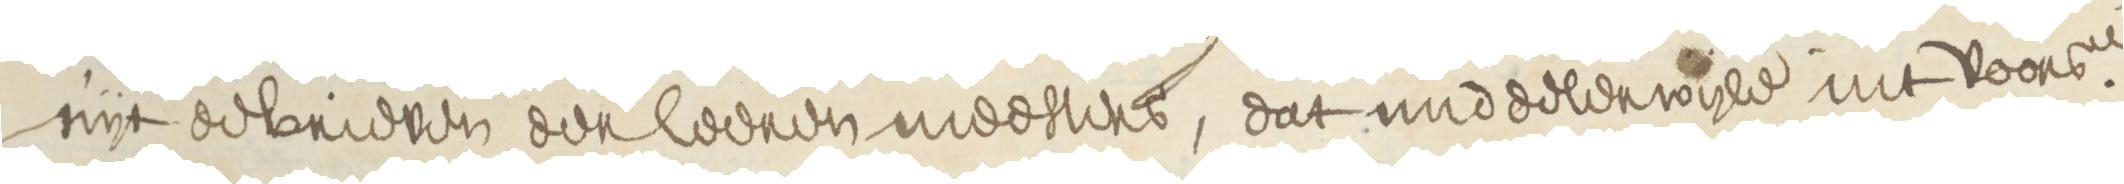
uijt de brieven der heeren meesters, dat middelerwijle in t voors.e
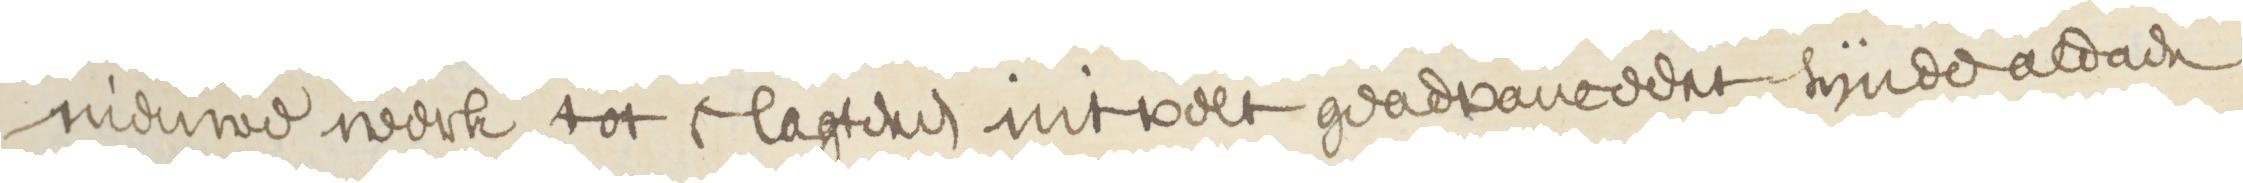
nieuwe werk tot 5 tlagteren in ’t velt geadvanceert sijnde aldaer
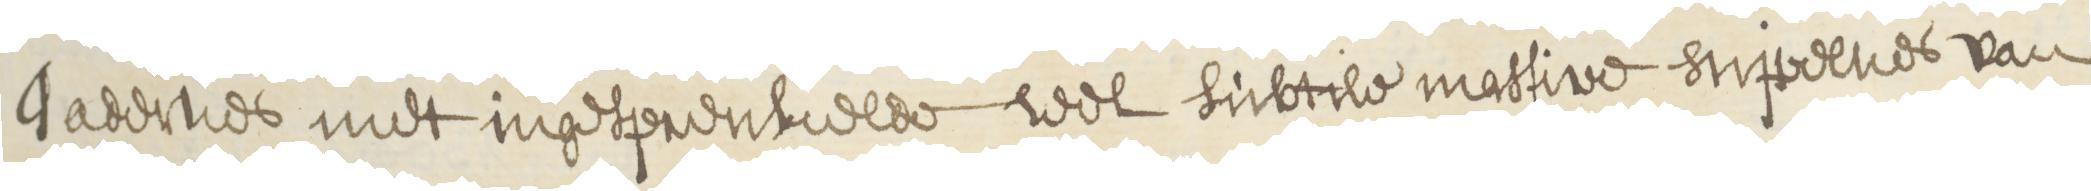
4 aderties met ingesprenkelde heel subtile massive stippelties van
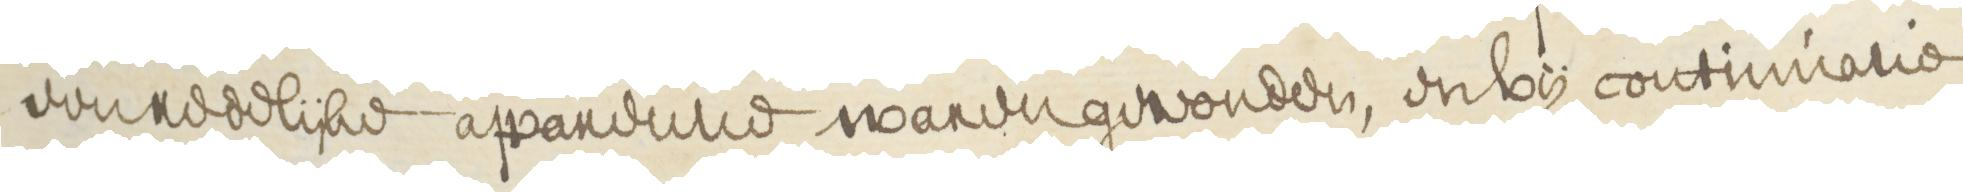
een redelijke apparentie waren gevonden, en bij continuatie
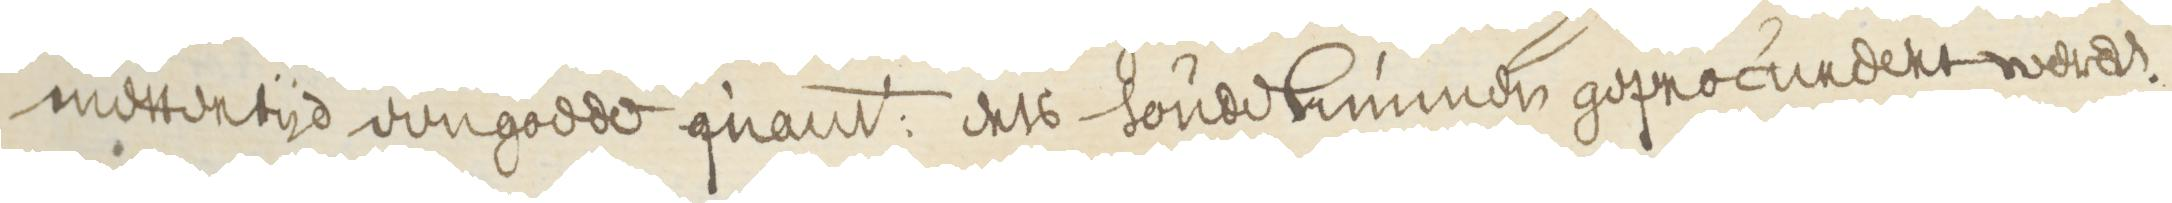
mettertijd een goede quant: erts soude kunnen geprocureert werden.
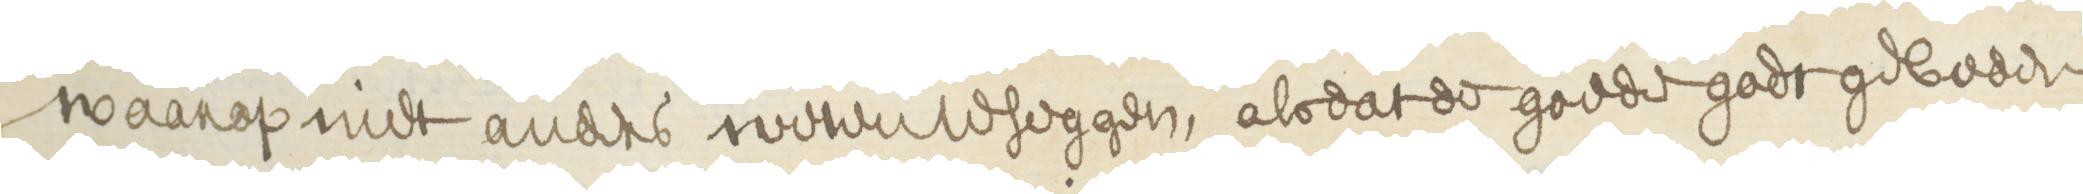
waar op niet anders weten te seggen, als dat de goede godt gebeden
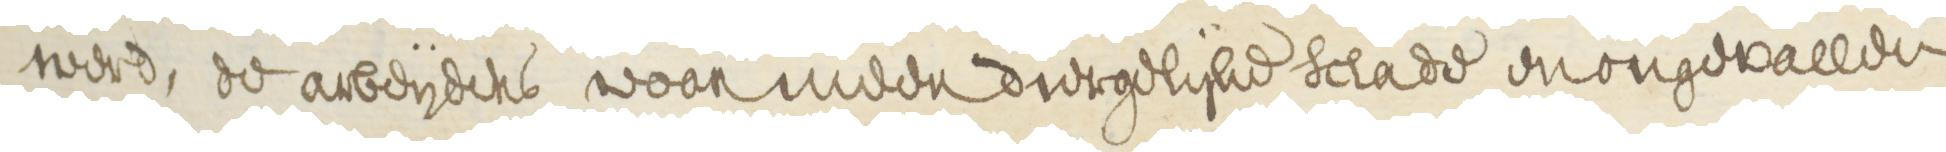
werd, de arbeijders voor meer diergelijke schade en ongevallen
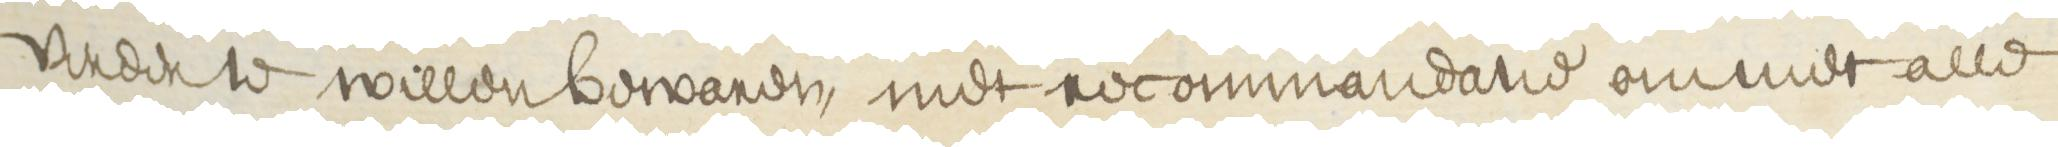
verder te willen bewaren, met recommandatie om met alle
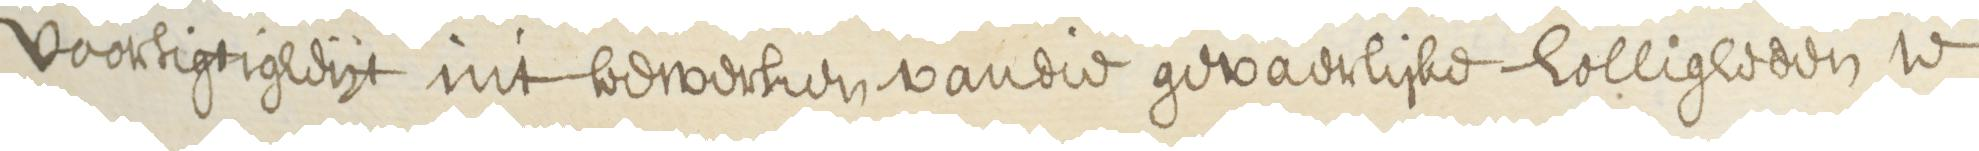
voorsigtigheijt in’t bewerken van die gevaerlijke holligheden te
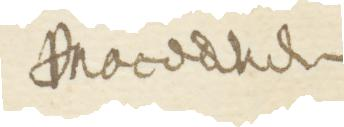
procederen
